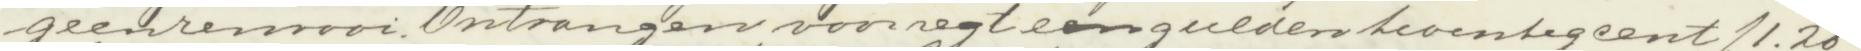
geen renvooi, Ontvangen voor regt een gulden twintig cent ƒ1.20
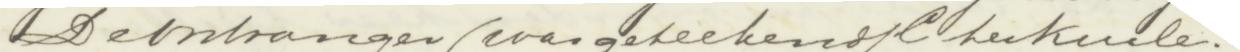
De ontvanger (was geteekend/ C ter Kuile.
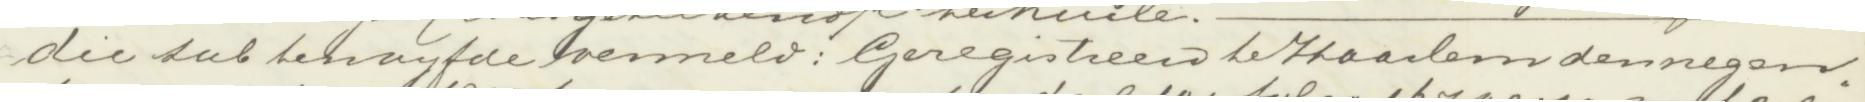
die sub ten vyfde vermeld: Geregistreerd te Haarlem den negen
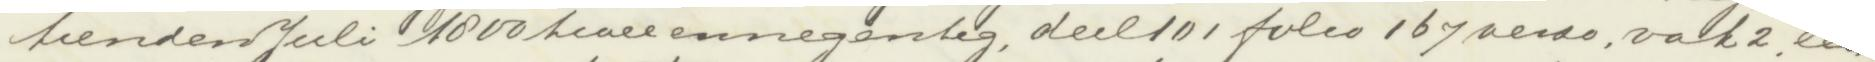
tienden Juli 1800 twee ennegentig, deel 101 folio 167 verso, vak 2, een
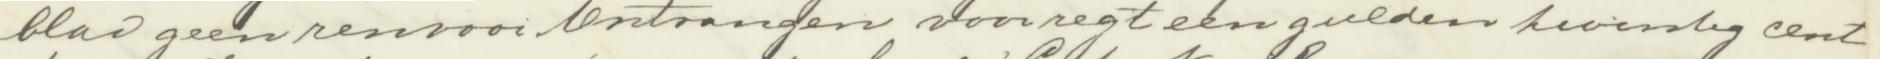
blad geen renvooi ontvangen voor regt een gulden twintig cent
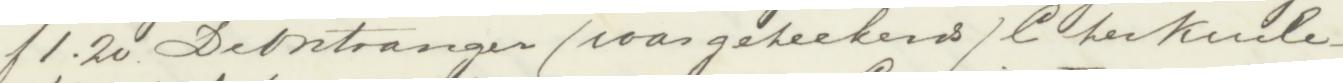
ƒ1.20. De ontvanger (was geteekend/ C ter Kuile
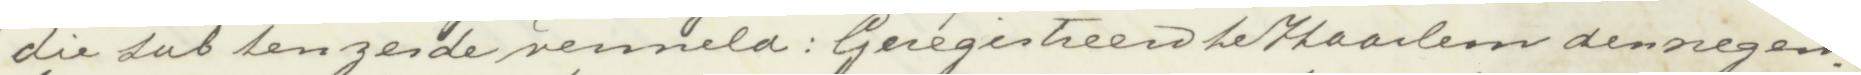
die sub ten zesde vermeld: Geregistreerd te Haarlem den negen„
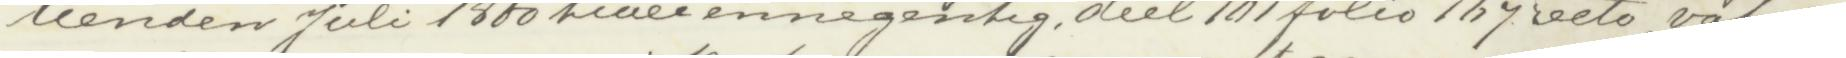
tienden Juli 1800 twee ennegentig, deel 101 folio 167 recto, vak 4,
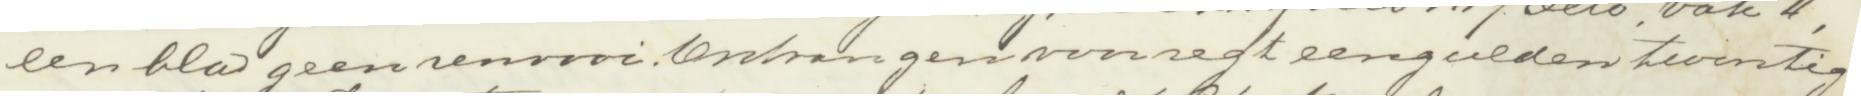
een blag geen renvooi. Ontvangen voor regt eengulden twintig
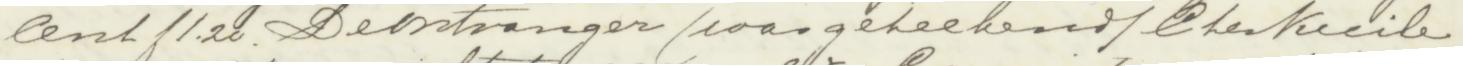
Cent ƒ1.20. De Ontvanger /was geteekend/ C ter Kuile
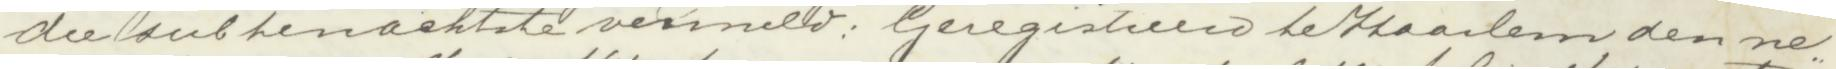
die sub ten achtste vermeld, Geregistreerd te Haarlem den ne
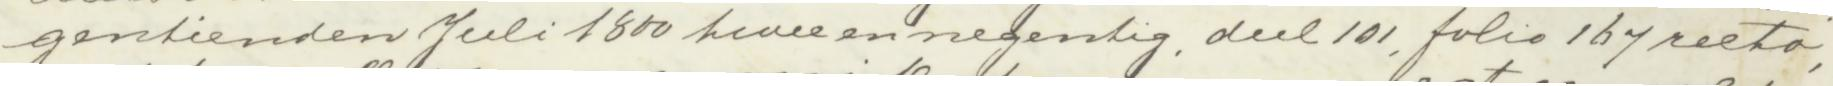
gentienden Juli 1800 twee en negentig deel 101 folio 167 recto,
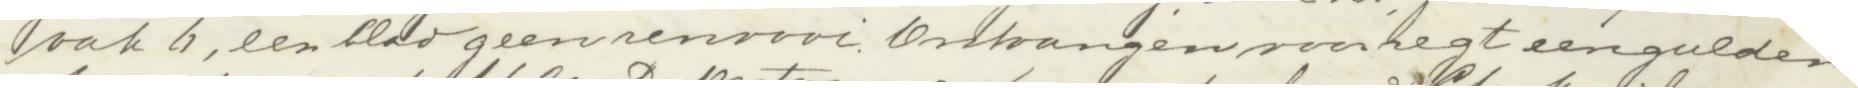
vak 6, een blad geen renvooi. Ontvangen voor regt een gulden
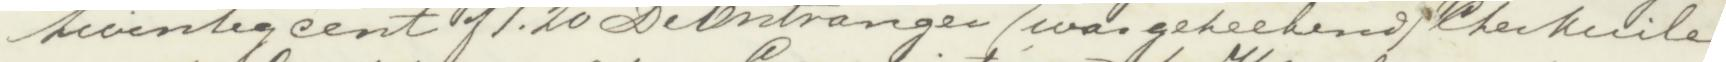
twintig cent ƒ1.20 De Ontvanger /was geteekend/ C ter Kuile
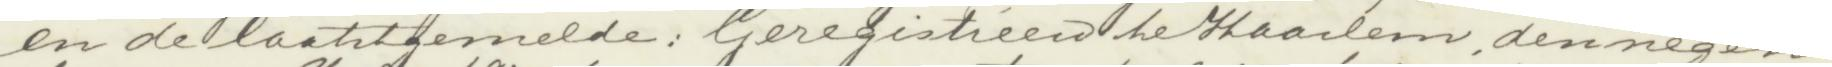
en de laatstgemelde: Geregistreerd te Haarlem, den negen„
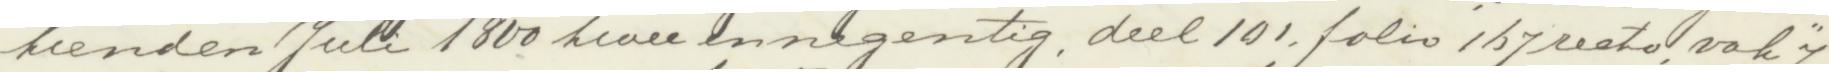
tienden Juli 1800 twee en negentig, deel 101, folio 167 recto, vak 7,
